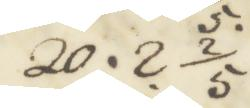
20. 2 2/5
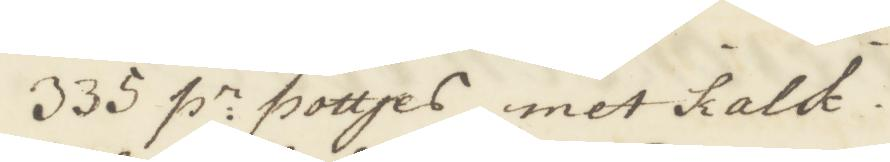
335 p:r pottjes met kalk.
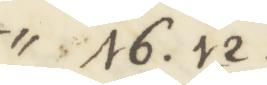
„ 16.12
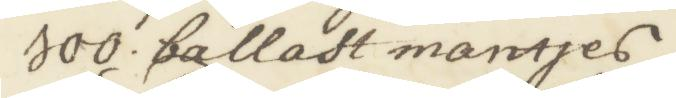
100: ballast mantjes
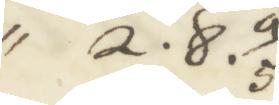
2.8.4/5.
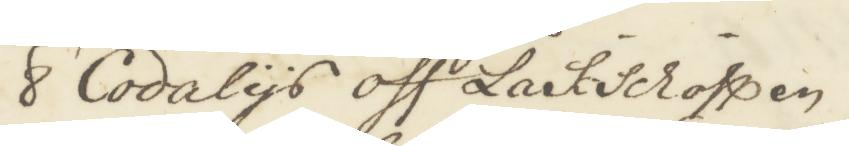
8 Codalijs off Laekschoppen
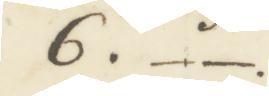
6. — —
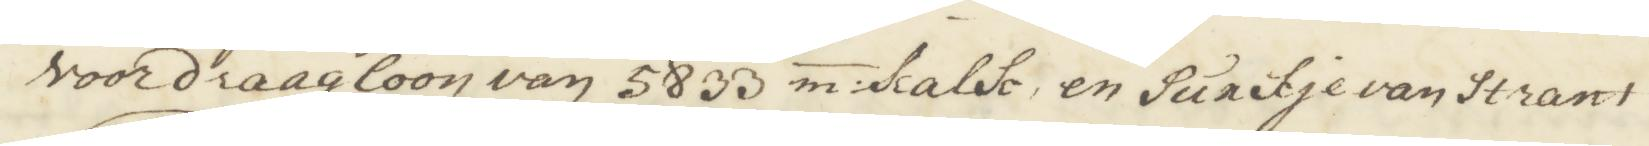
voor draagloon van 5833 m: kalk, en surkje van strant
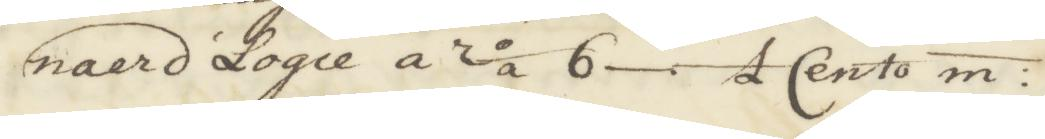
naer d' Logie a ro/a 6 –. 't Cento m:
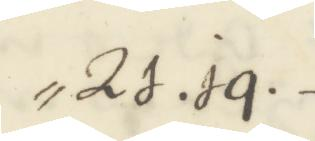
„ 21.19.
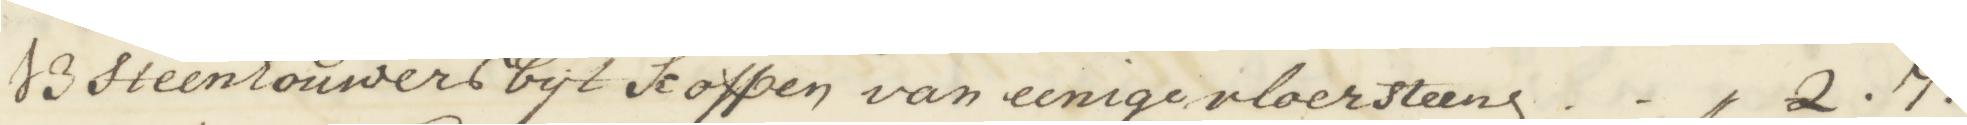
13 steenhouwers bijt koppen van eenige vloersteenen - - „ 2. 7.
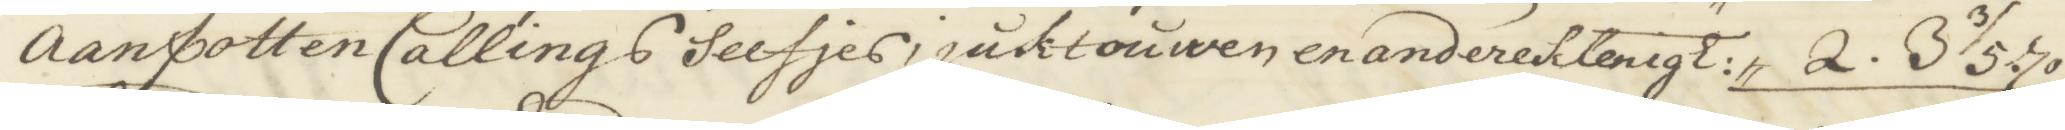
aanpotten Callings seefjes, juktouwen en andere kleningh: „ 2. 3 3/5.
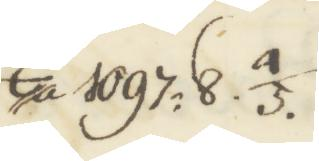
r„oa 1097: 8. 4/5.
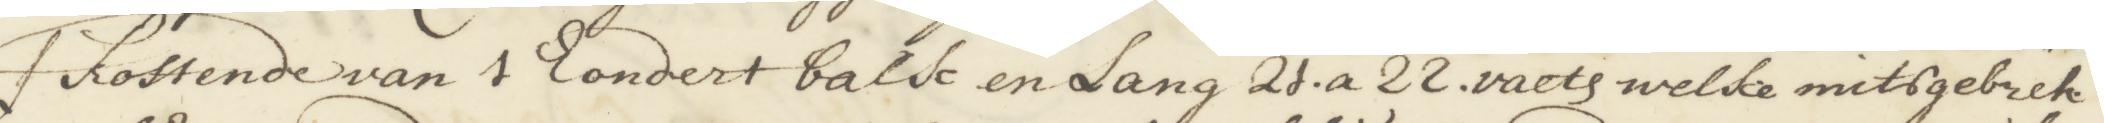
T kostende van 1 hondert balk en Lang 21. a 22. vaets welke mits gebrek
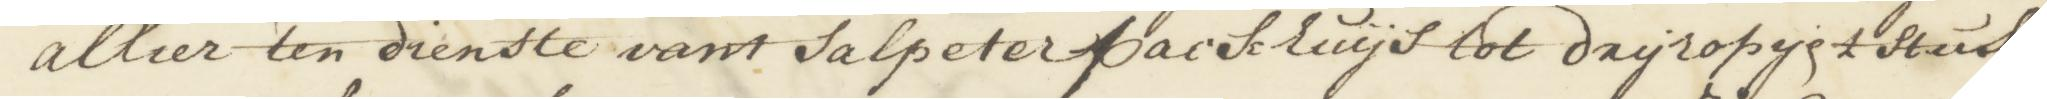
alhier ten dienste vant salpeter Packhuijs tot drijropijen t stuk
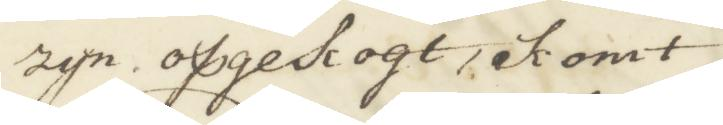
zyn opgekogt, komt
